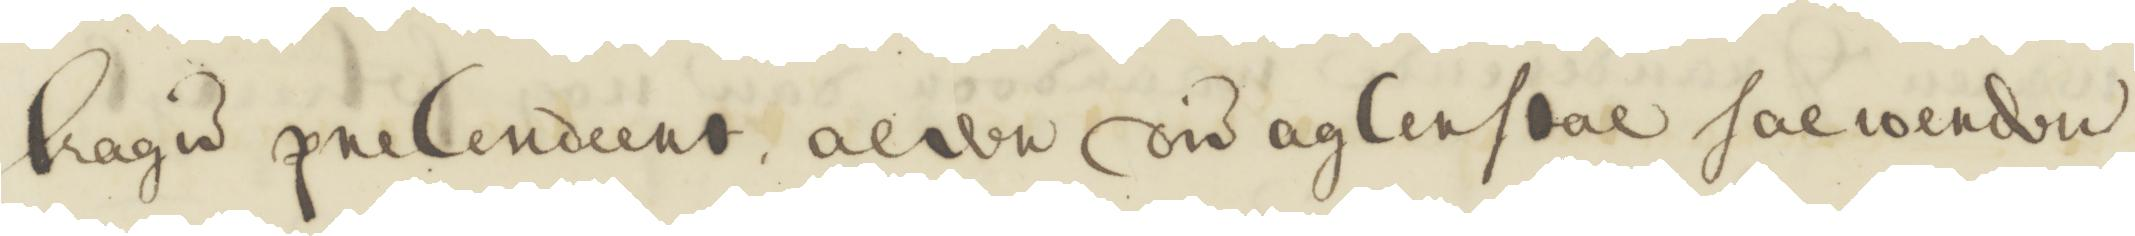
kagie pretendeert, aleer die agterstal sal werden
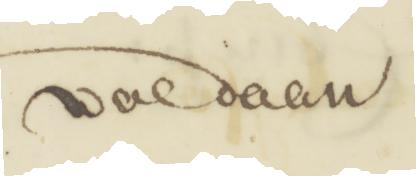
voldaan
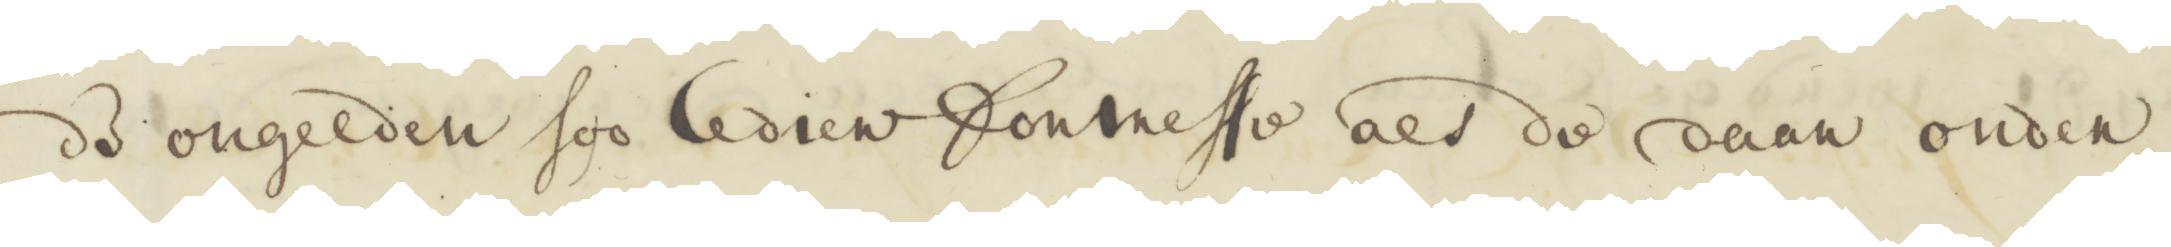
de ongelden soo te dier fortresse als de daar onder
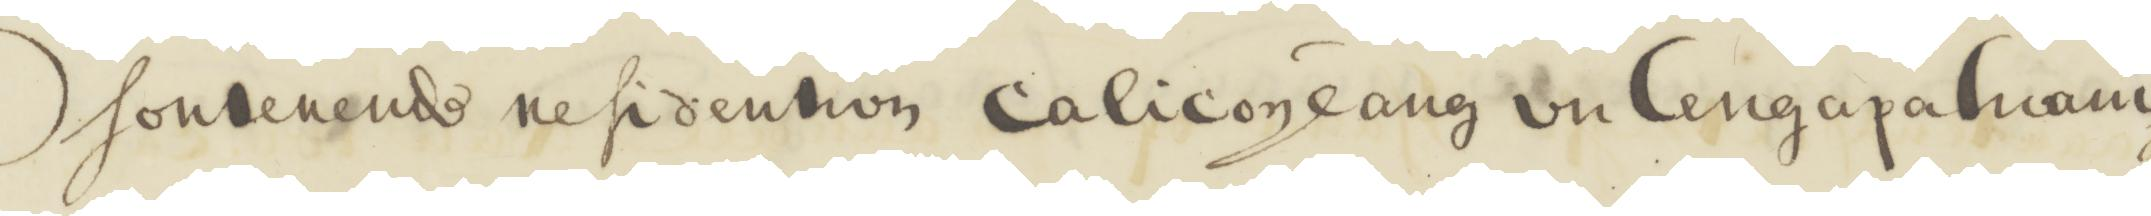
sorterende residentien calicoijlang en tengapatnam
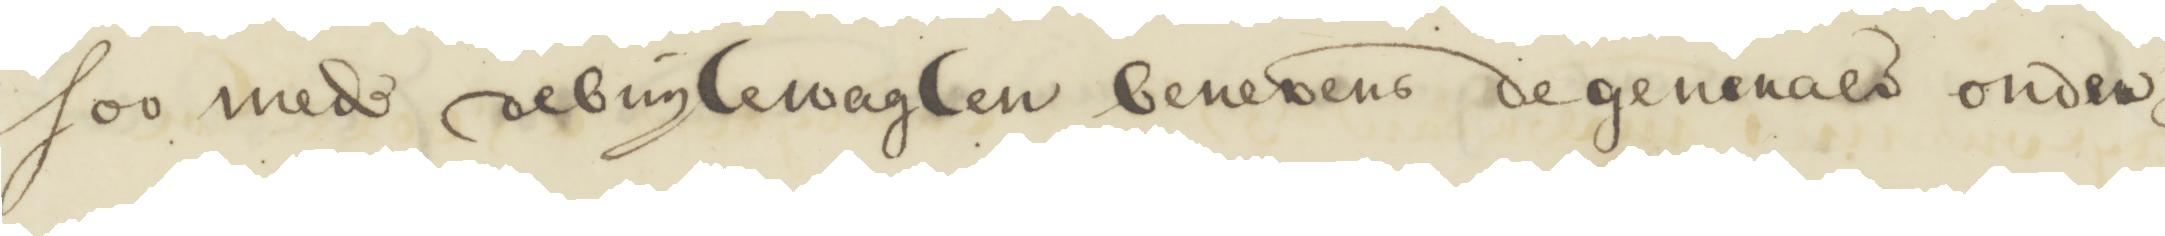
soo mede de buijtewagten benevens de generale onder
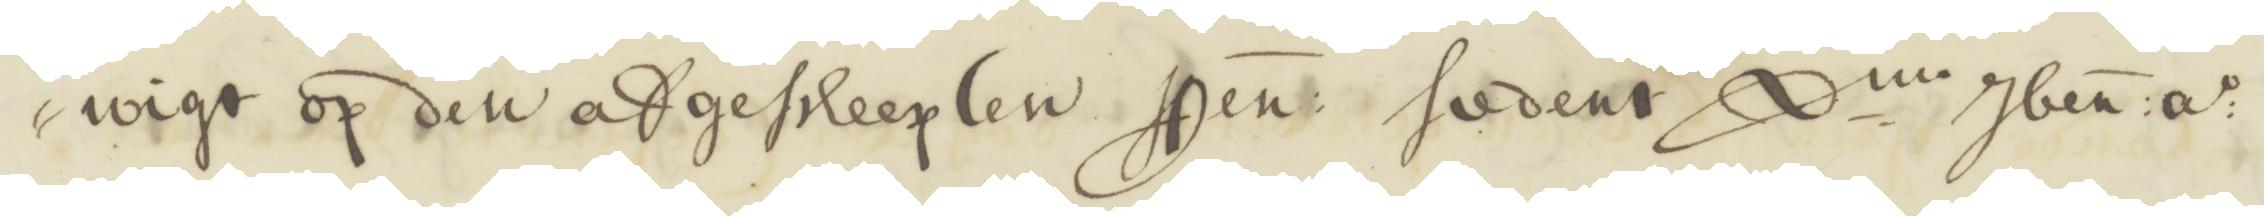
=wigt op den afgescheepten pper: sedert p=mo 7ber: a:o
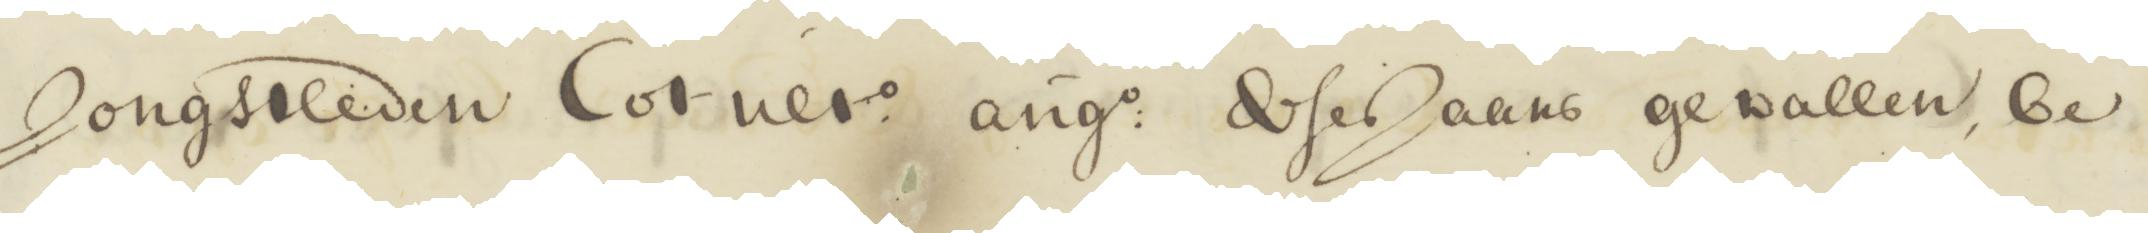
Jongstleden tot ult:o aug:o deses jaars gevallen, be
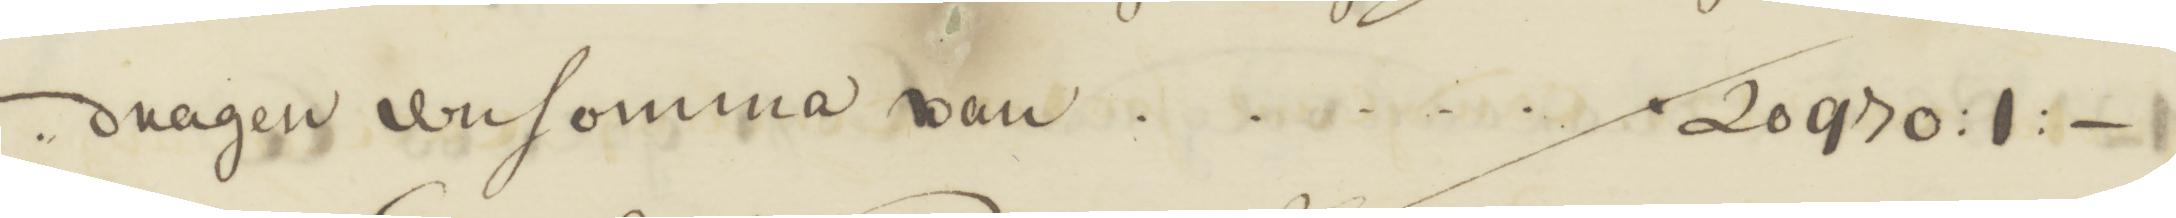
„dragen een somma van . . . . . . ƒ20970: 1 : —
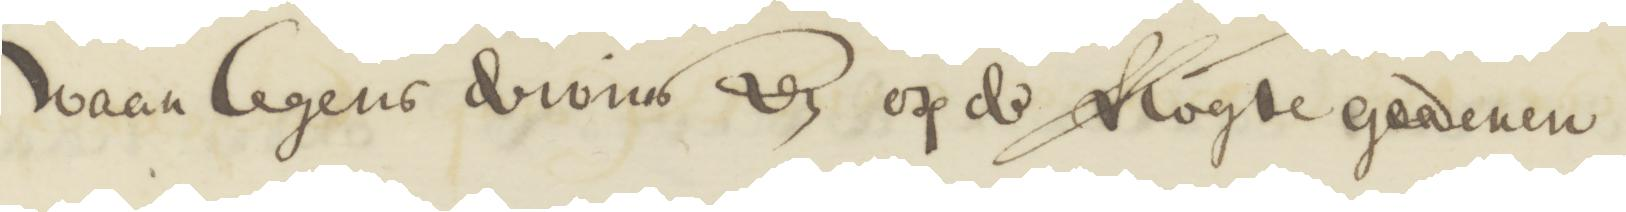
waar tegens dewinsten op de vercogte goederen
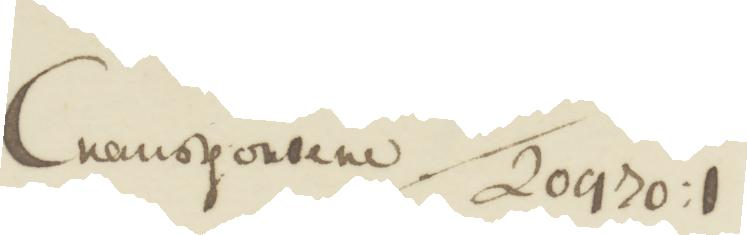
Transportere ƒ20470:1
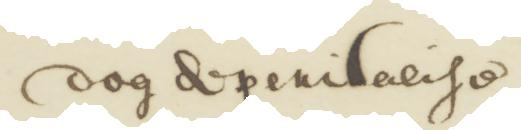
dog de peritalise
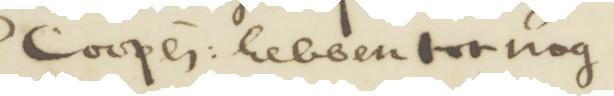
Coopl: hebben tot nog
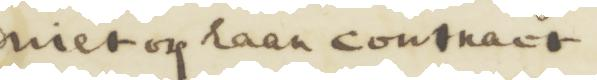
niet op haar contract
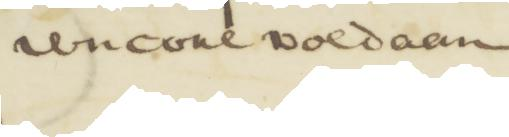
een corl voldaan
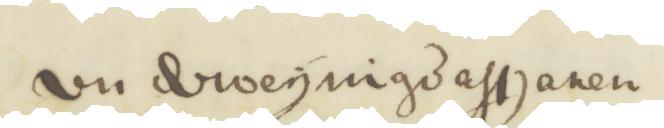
en deweijnige apparen
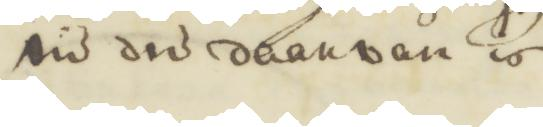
tie die daar van is
